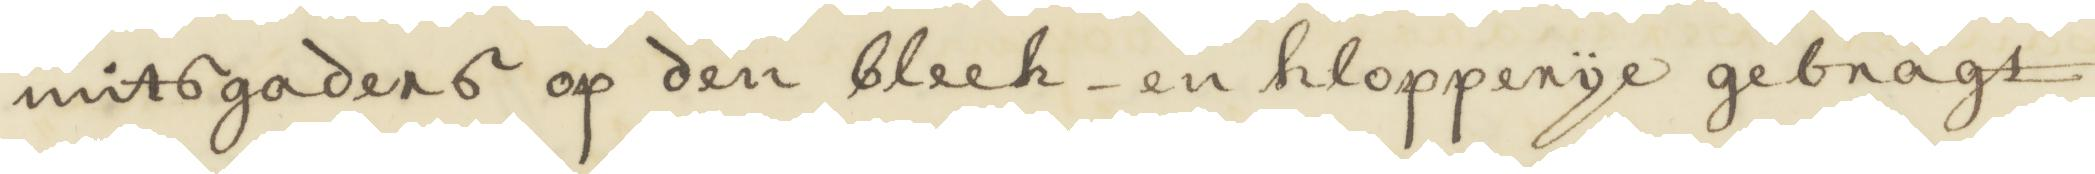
mitsgaders op den bleek- en klopperije gebragt
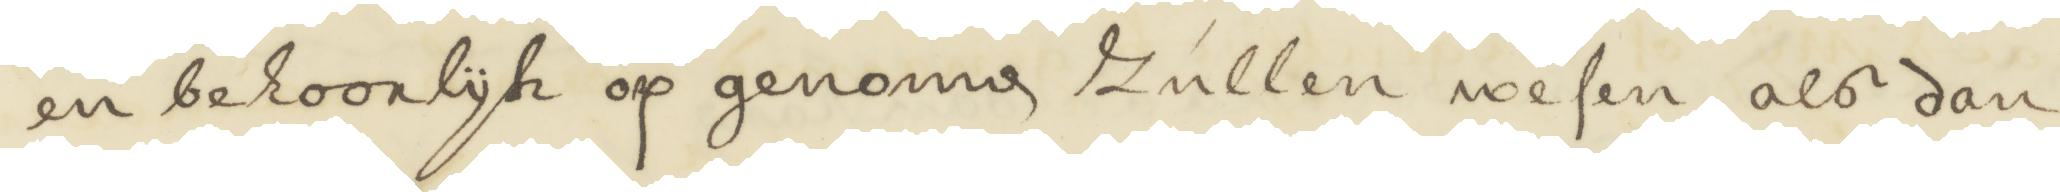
en behoorlijk op genomen zullen wesen, als dan
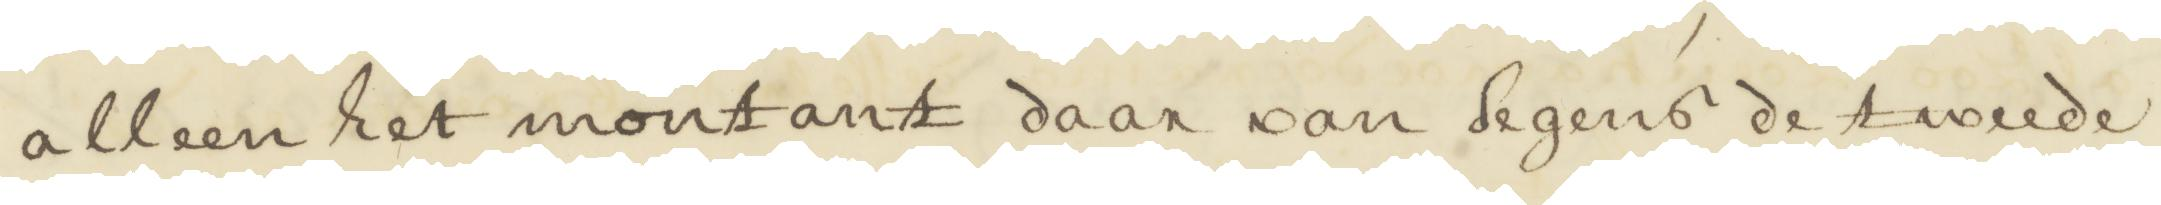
alleen het montant daar van tegens de tweede
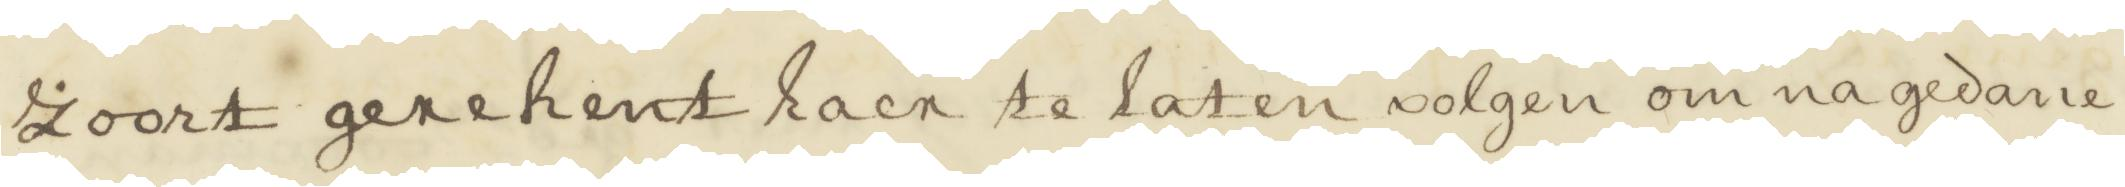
zoort gerekent haer te laten volgen om na gedane
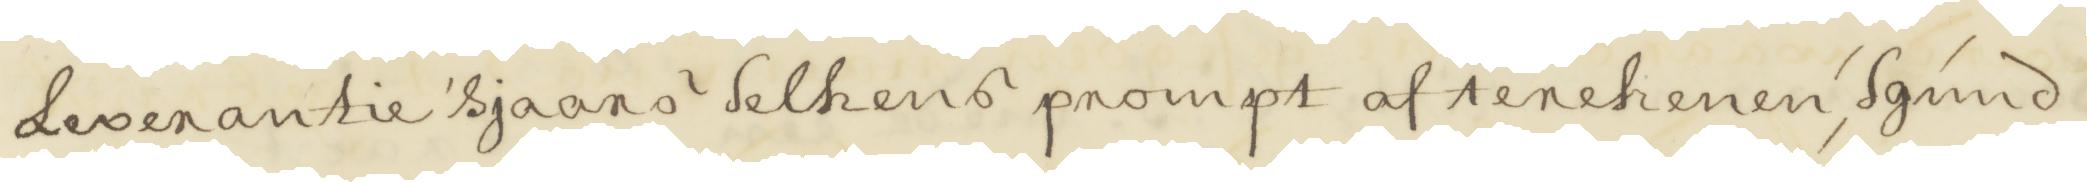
Leverantie 'sjaars telkens prompt af terekenen, 'tgund
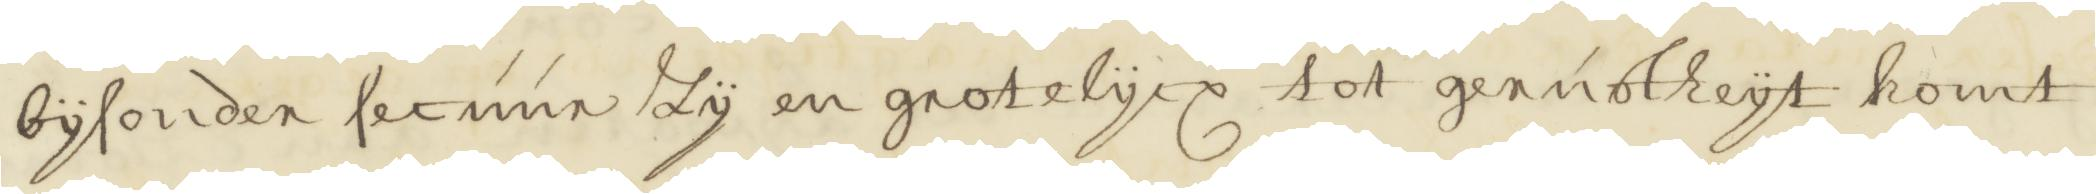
bijsonder secuur zij en grotelijcx tot gerustheijt komt
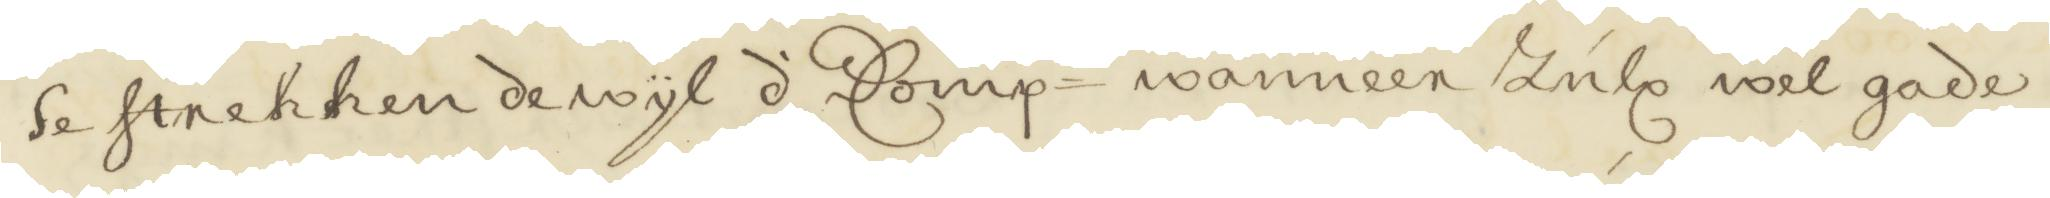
te strekken de wijl d’ EComp=s wanneer zulx wel gade
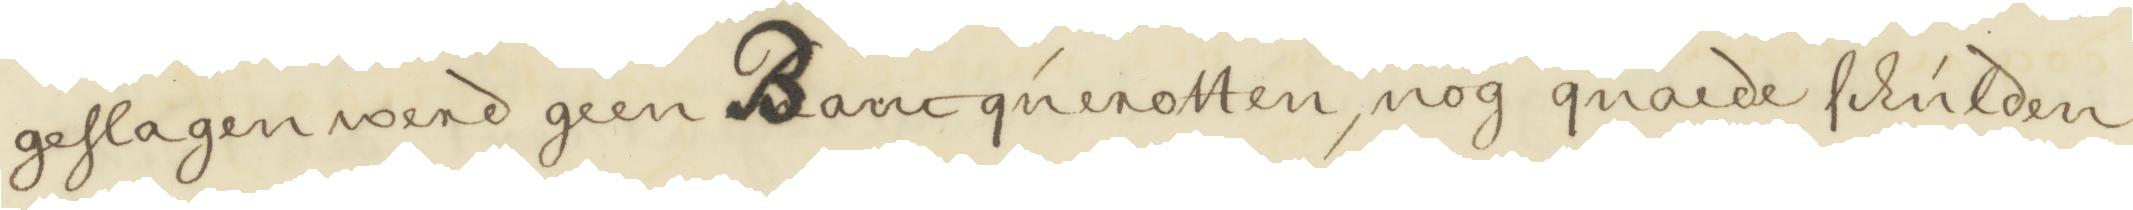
geslagen werd geen Bancquerotten, nog quaede schulden
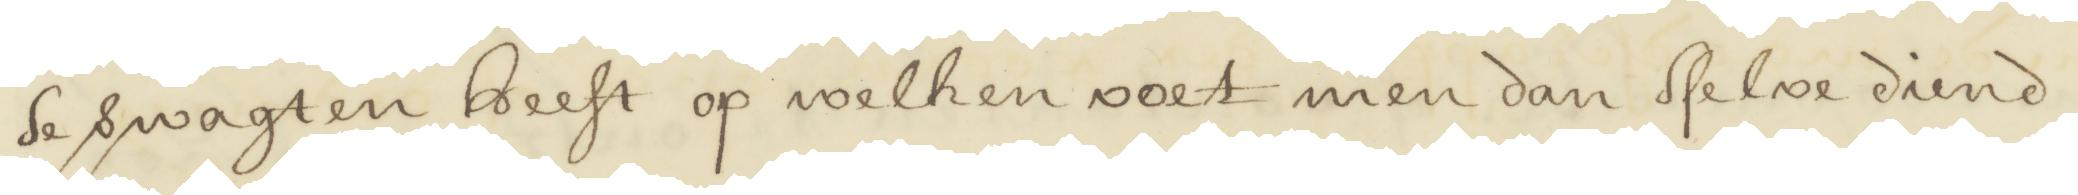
te verwagten heeft op welken voet men dan tselve diend
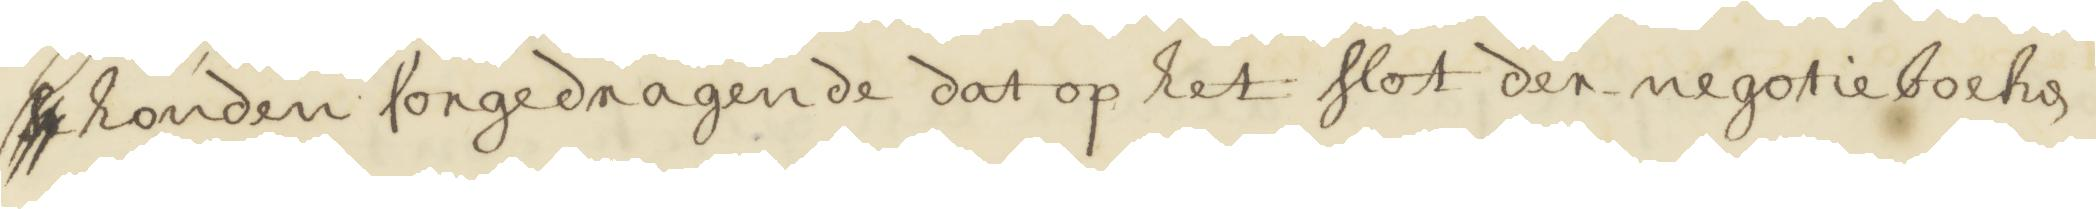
te houden sorgedragende dat op het slot der negotie boeken
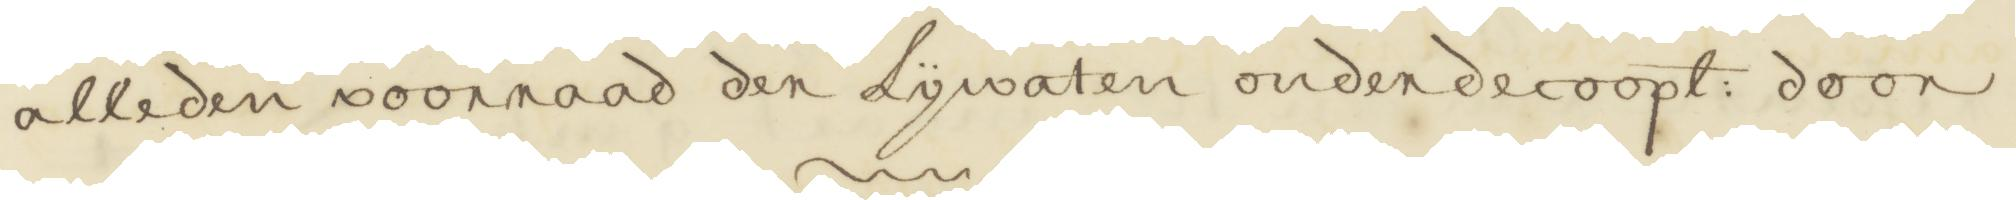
alle den voorraad der Lijwaten onder de coopl: door
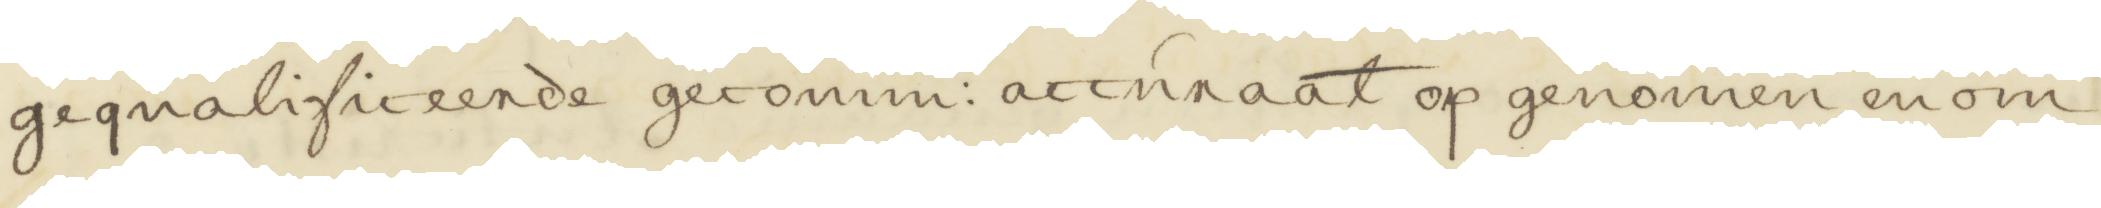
gequalificeerde gecomm: accuraat op genomen, en om
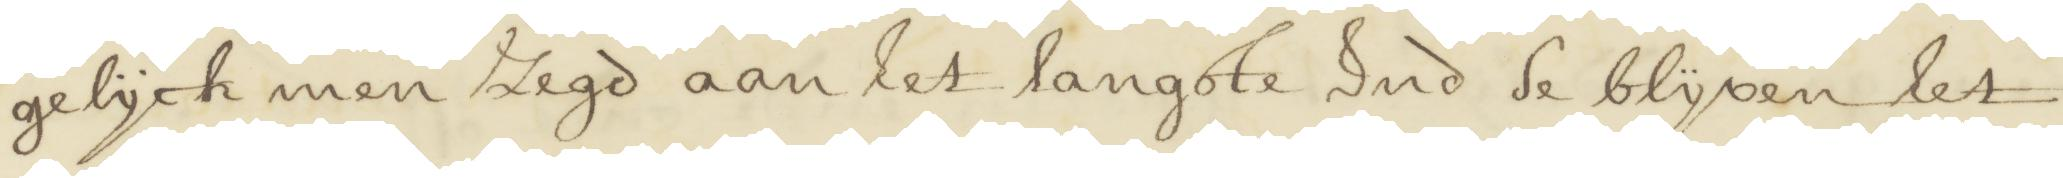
gelijck men zegd aan het langste End te blijven het
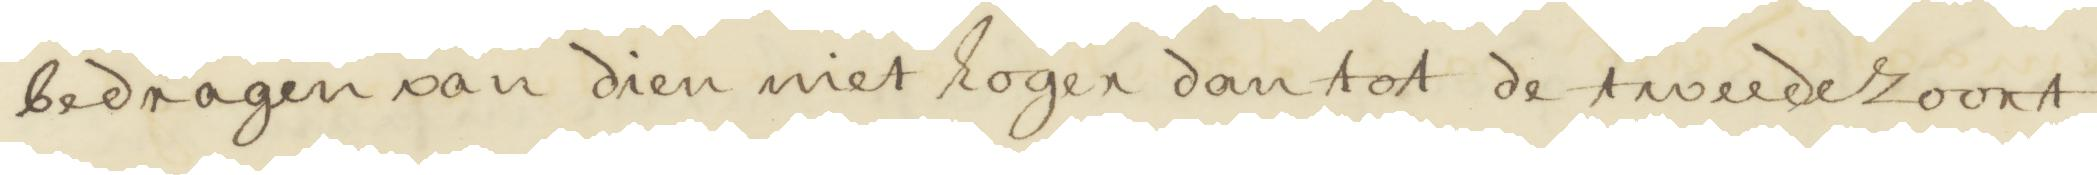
bedragen van dien niet hoger dan tot de tweedezoort
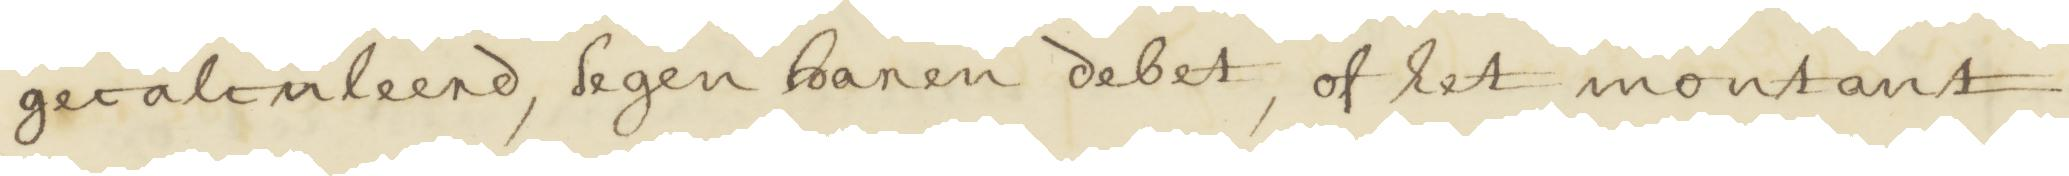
gecalculeerd, tegen haren debet, of het montant
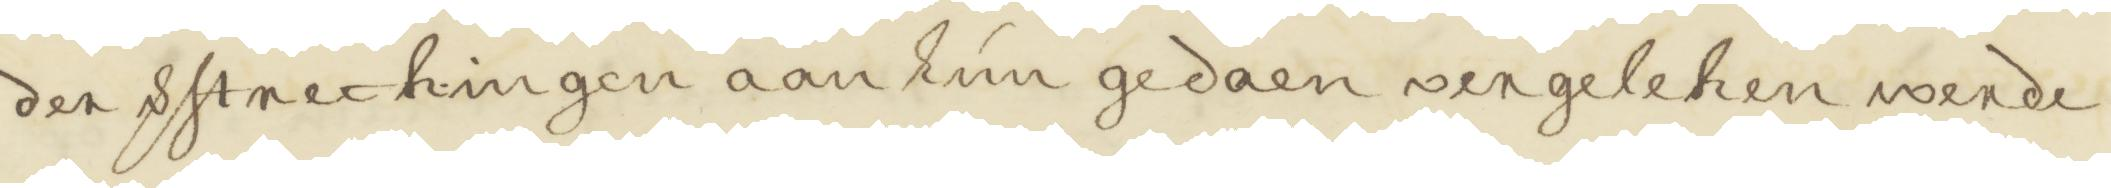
der verstreckingen aan hun gedaen vergeleken werde
